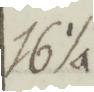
16¼
